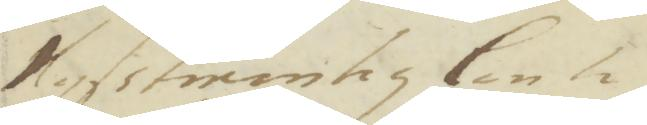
Vyf en twintig Cents
